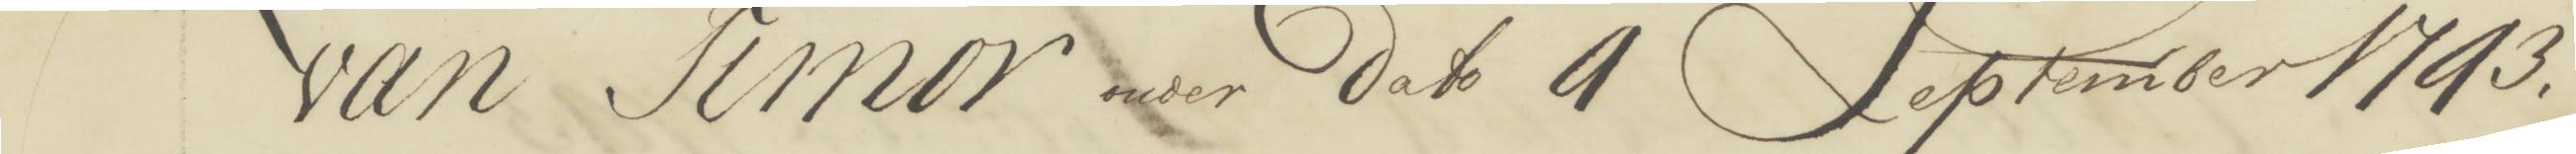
Van Timor onder dato 4 September 1743.
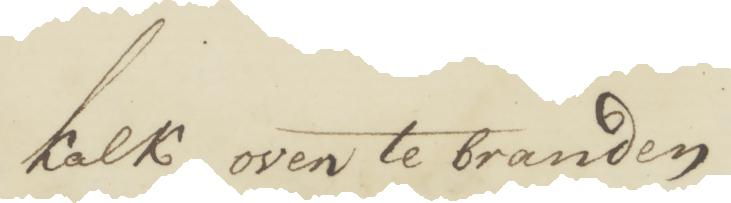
kalk oven te branden
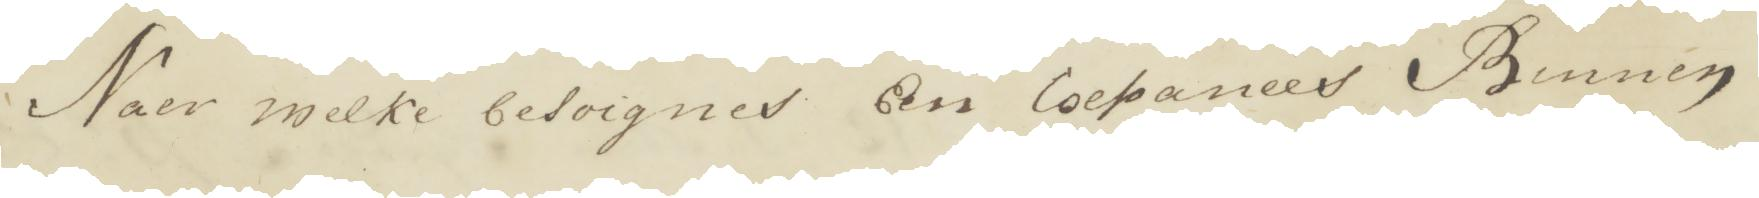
Naer welke besoignes Een coepanees Binnen
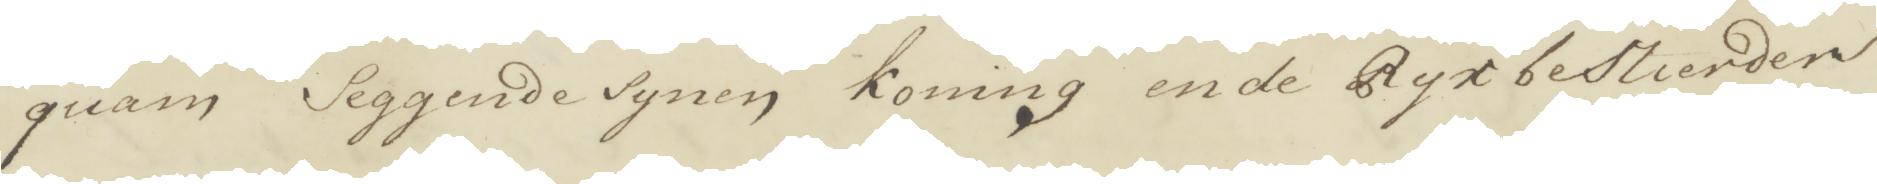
quam seggende synen koning en de Ryx bestierder
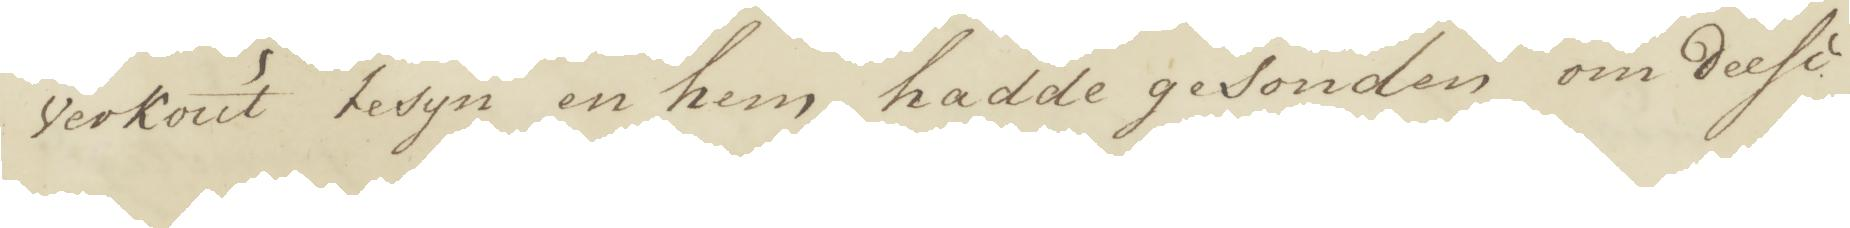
verkout tesyn en hem hadde gesonden om deese
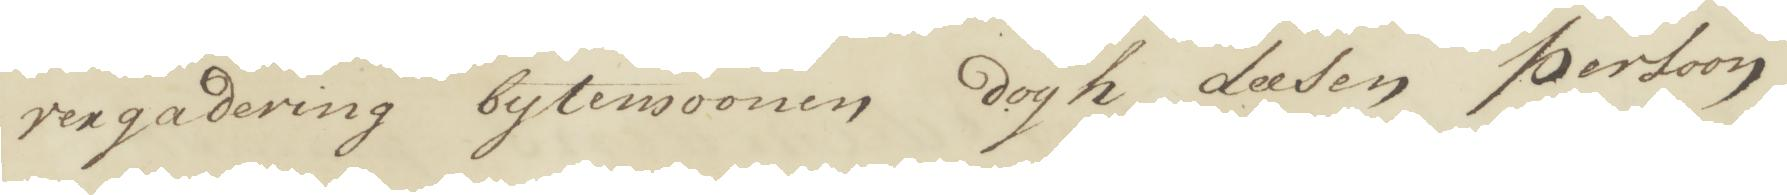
vergadering bytewoonen dogh deesen persoon
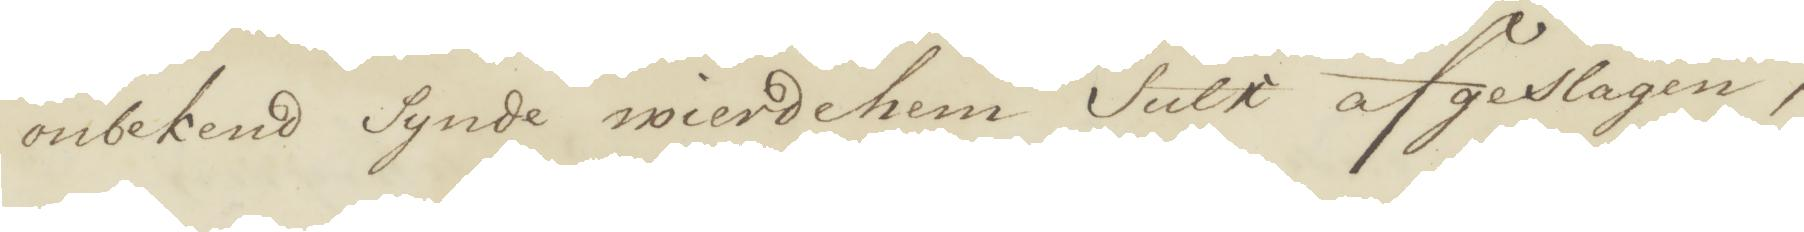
onbekend synde wierdehem sulx afgeslagen,
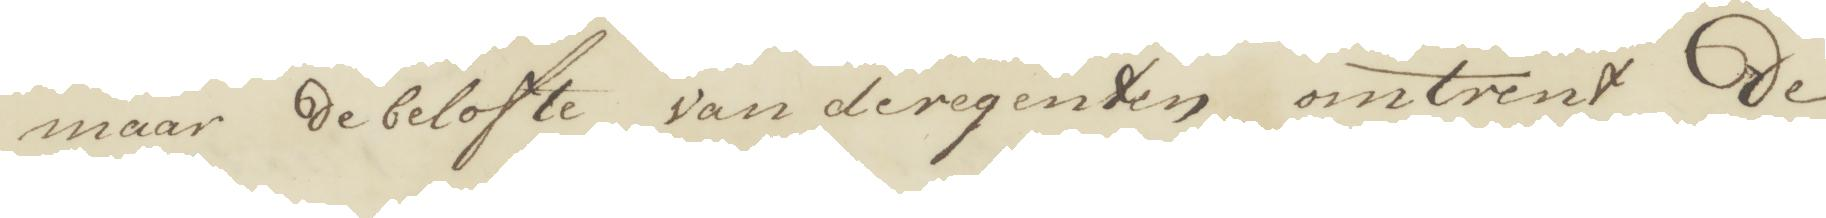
maar de belofte van deregenten omtrent de
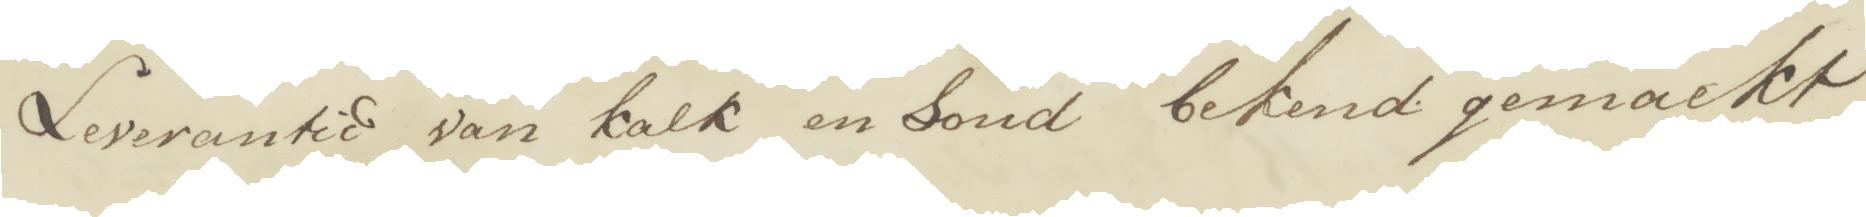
Leverantie van kalk en soud bekend gemaekt
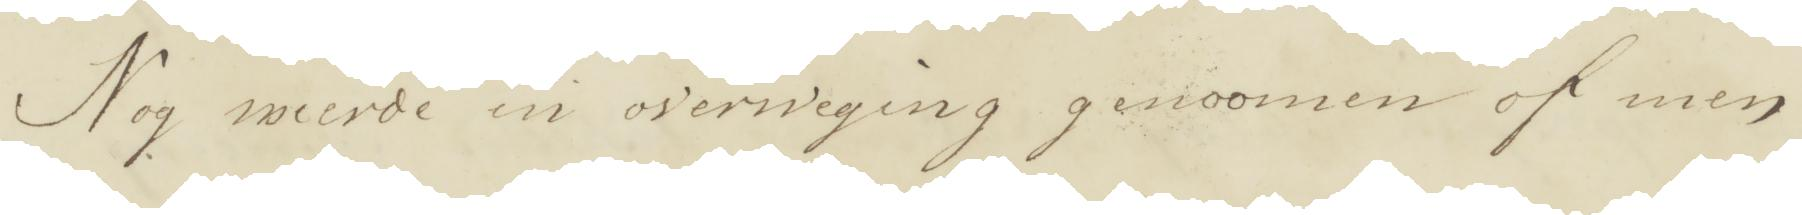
Nog wierde in overweging genoomen of men
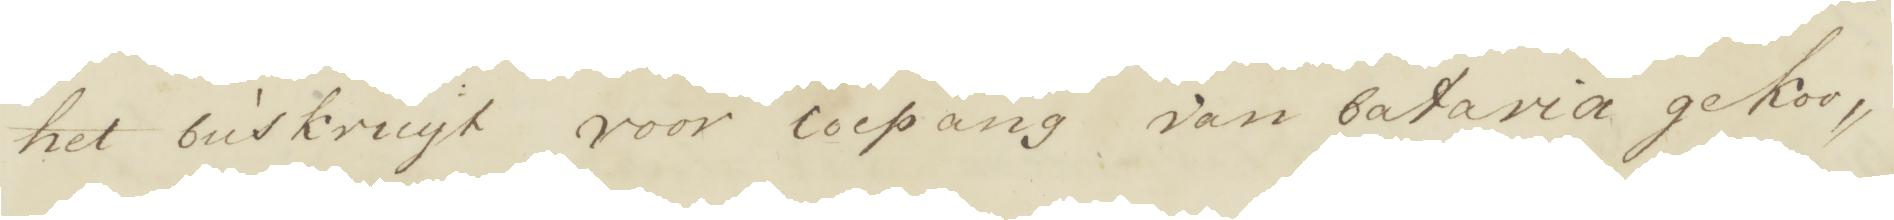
het buskruijt voor coepang van batavia gekoo„
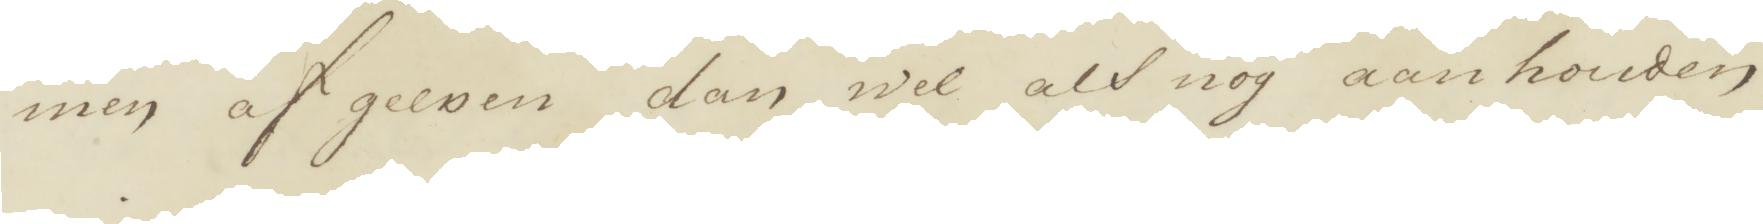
men af geeven dan wel als nog aan houden
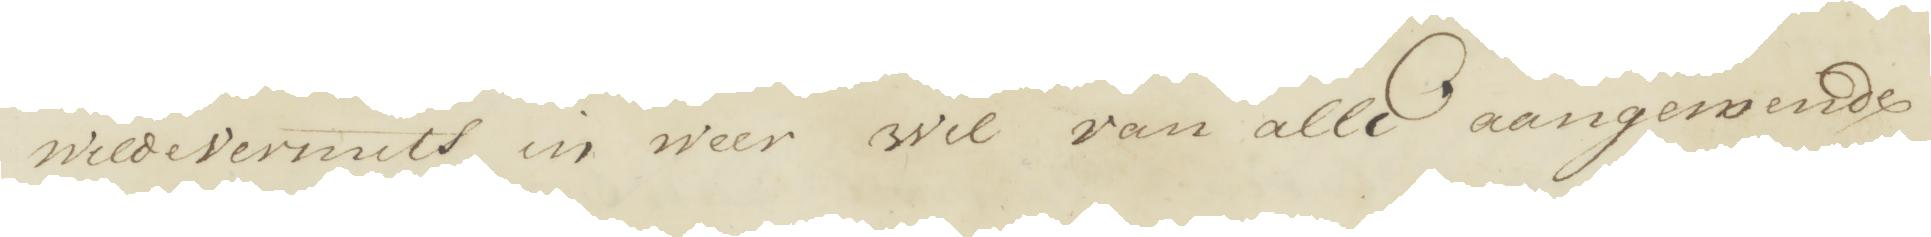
wilde vermits in weer wil van alle aangewende
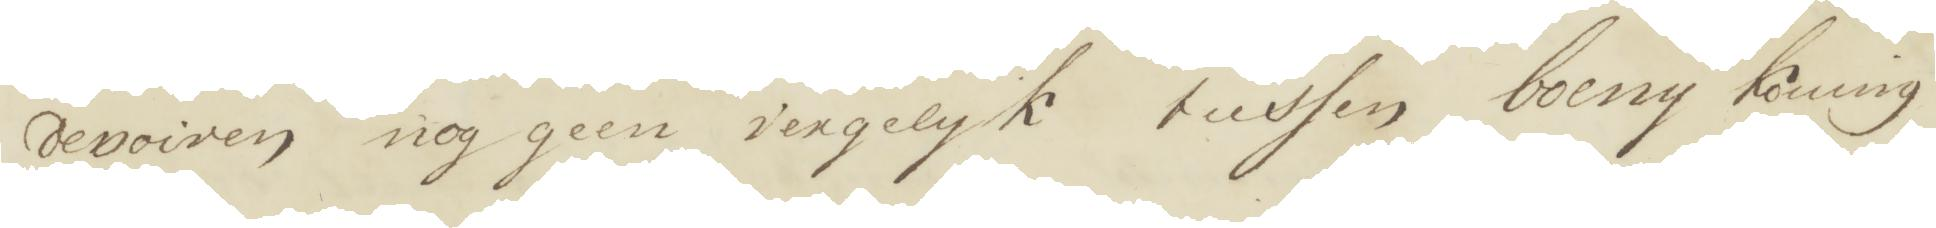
devoiren nog geen vergelijk tussen boeny koning
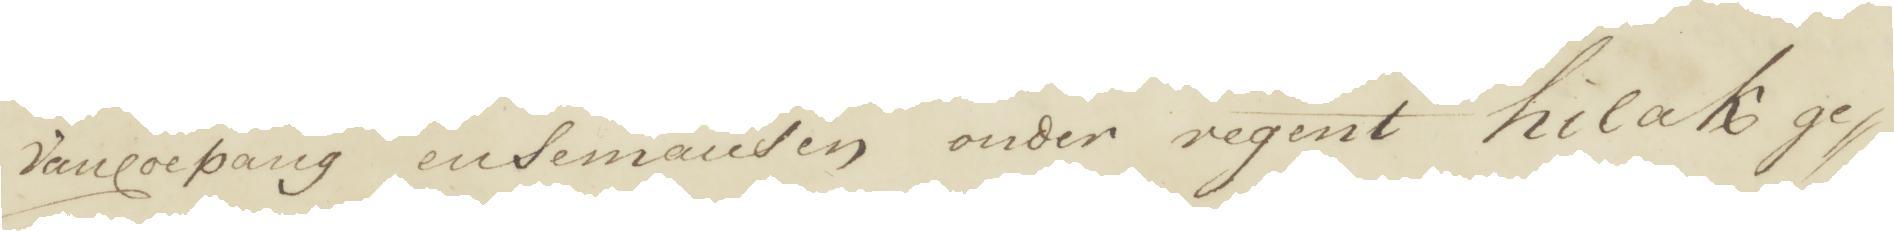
vancoepang ensemausen onder regent hilak ge„
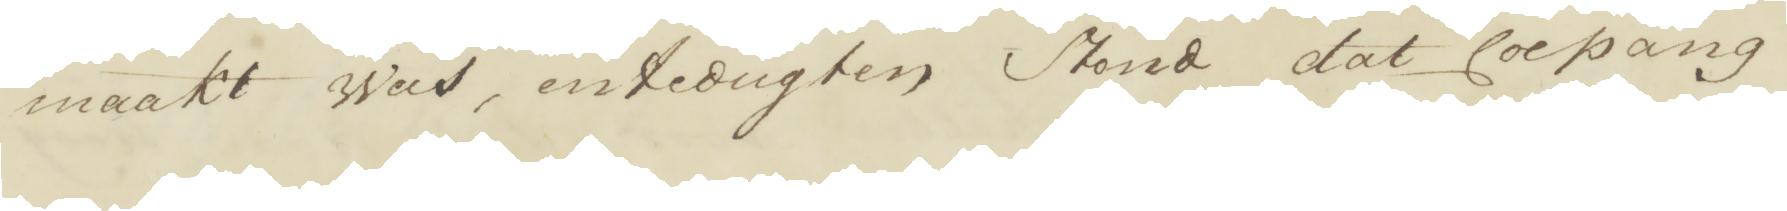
maakt was, entedugten stond dat coepang
